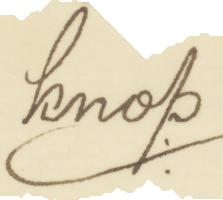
knop
